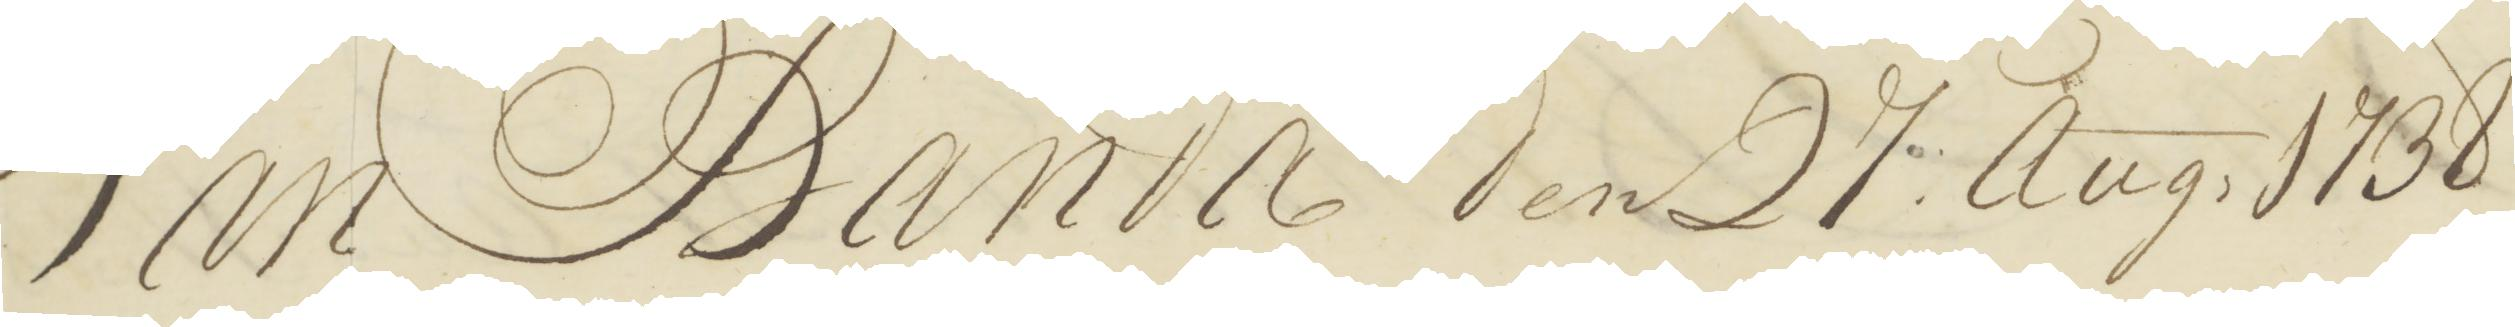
Van Banda den 27:' Aug: 1738
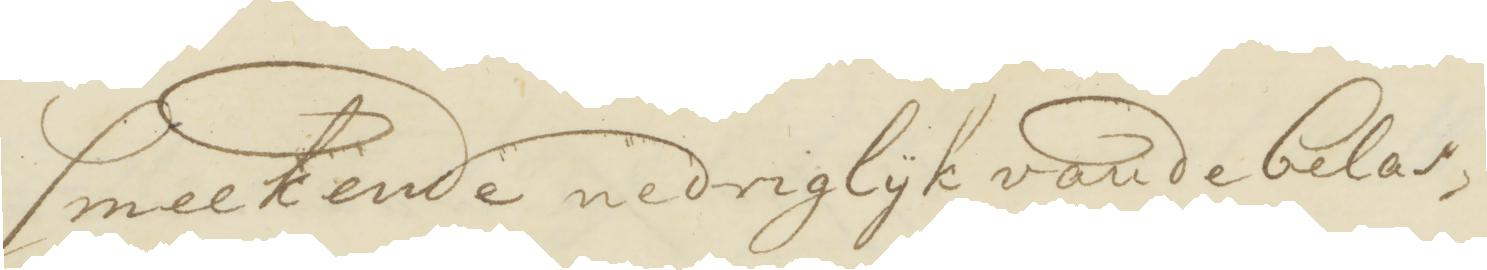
smeekende nedriglijk van de belas„
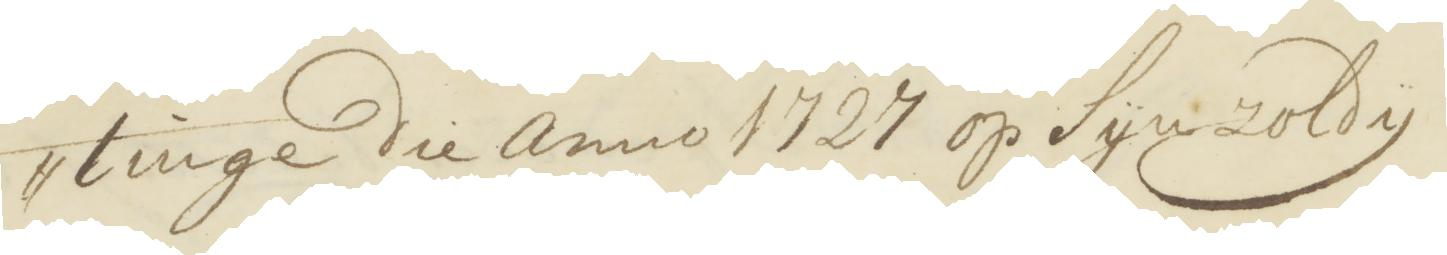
„tinge die anno 1727 op sijn zoldij
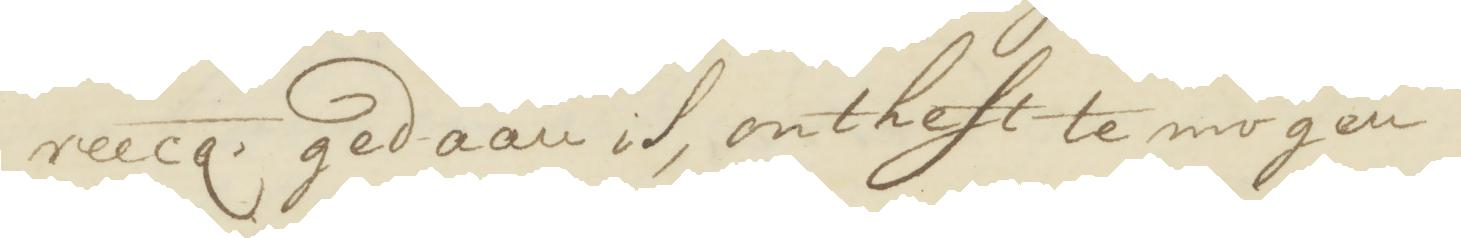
reecq: gedaan is, ontheft te mogen
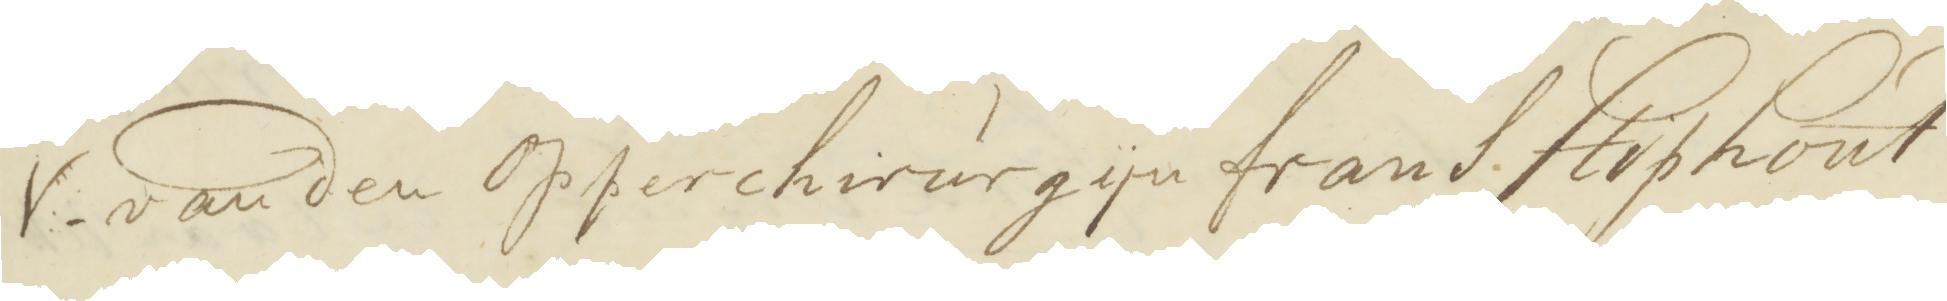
1: van den opperchirurgijn frans Stiphout
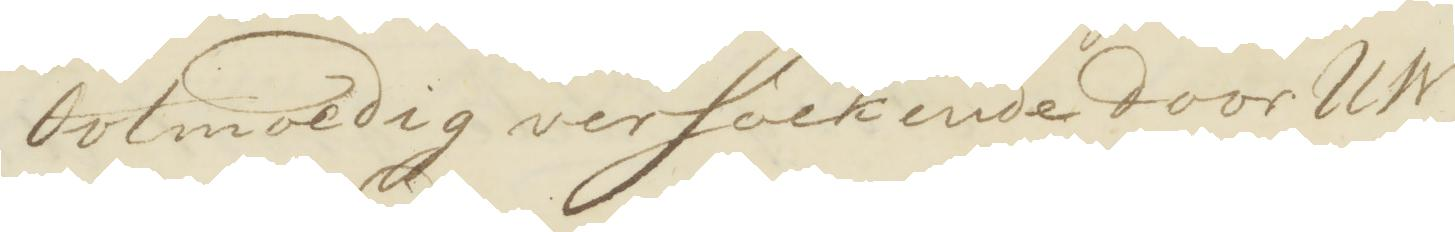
Ootmoedig versoekende door UW
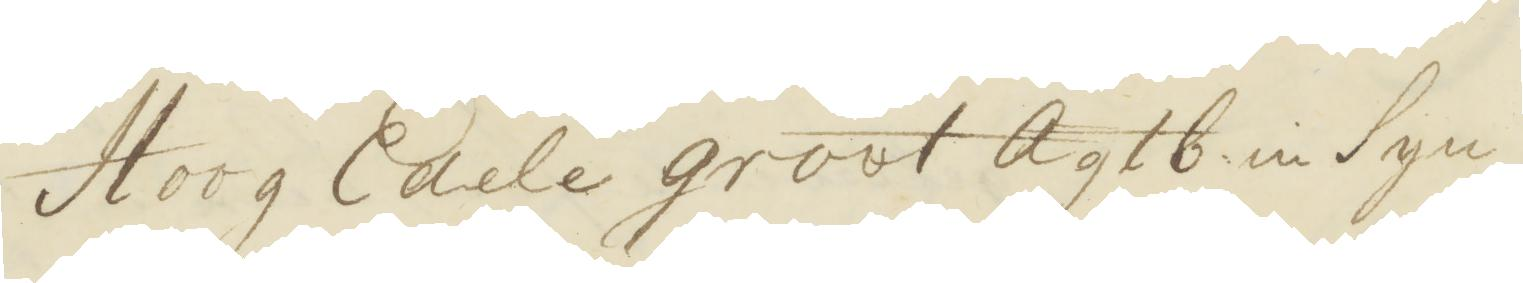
Hoog Edele groot Agtb: in sijn
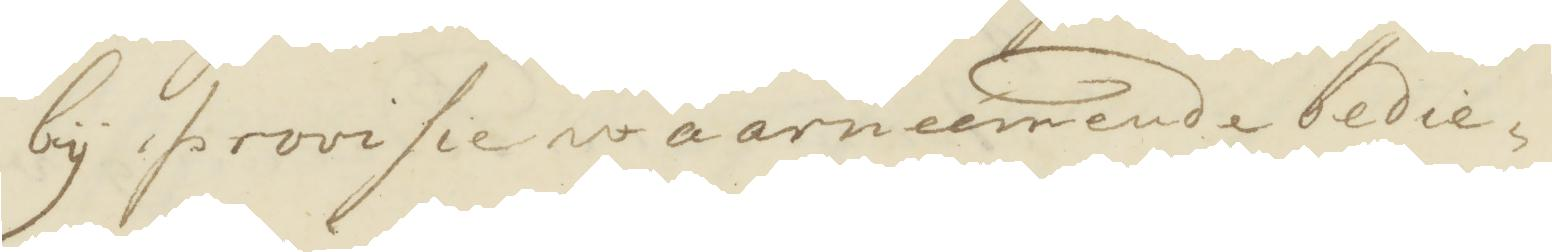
bij provisie waarneemende bedie„
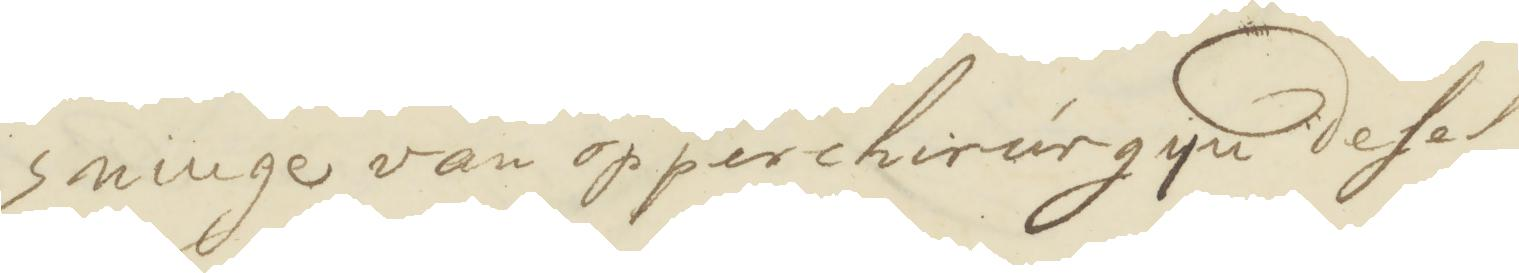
ninge van opperchirurgijn deses
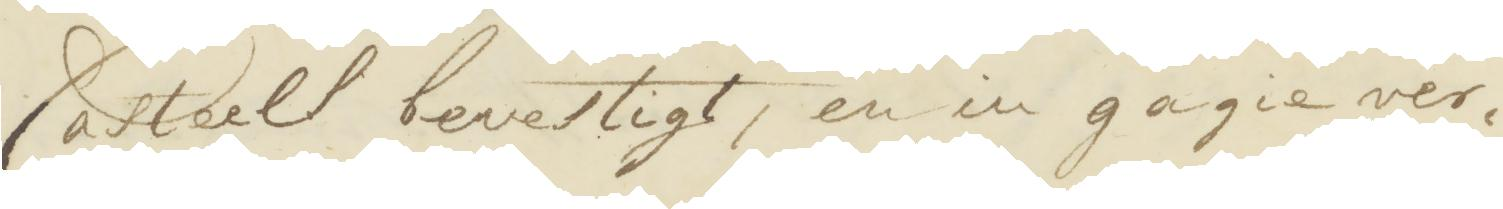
Casteels bevestigt, en in gagie ver
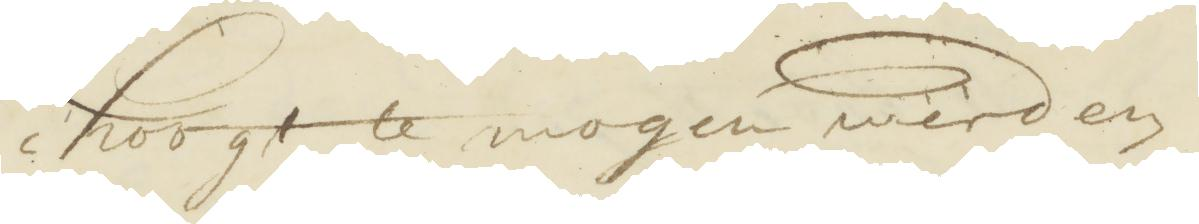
hoogt te mogen werden
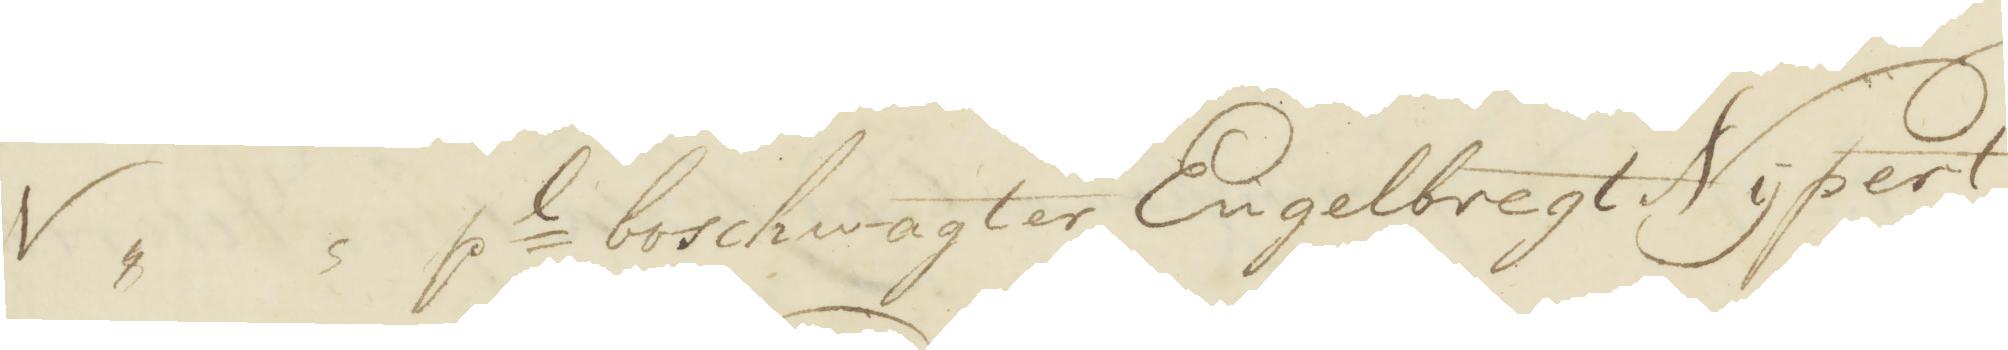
1 „ „ p=l boschwagter Engelbregt Nijpert
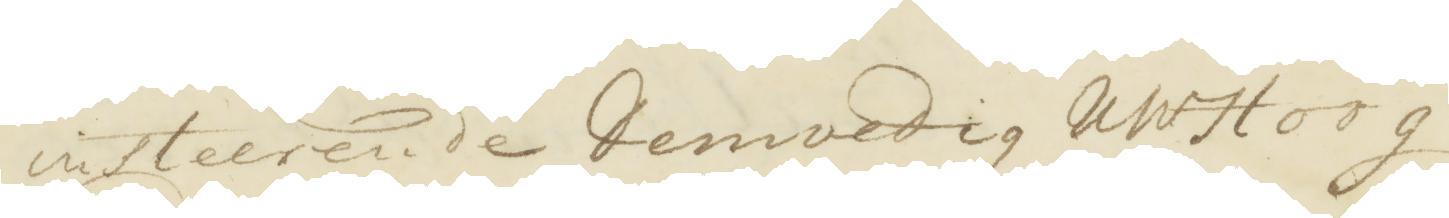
insteerende demoedig UWHoog
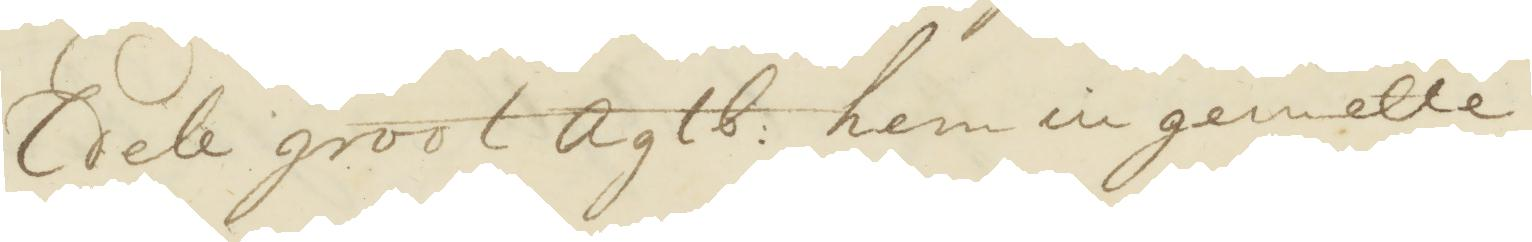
Edele groot Agtb: hem in gemelte
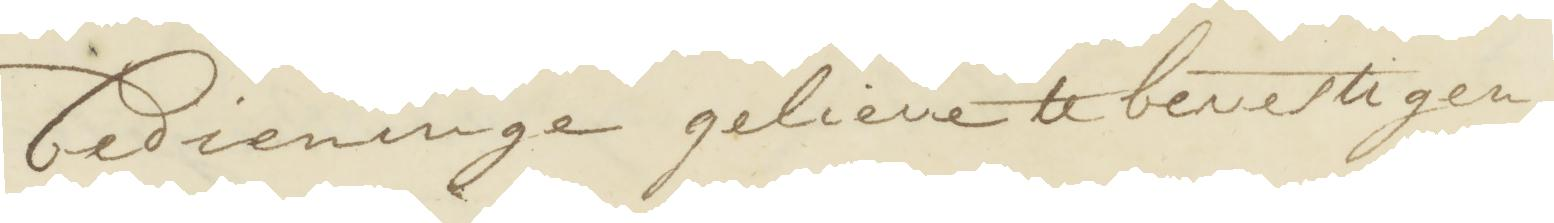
bedieninge gelieve te bevestigen
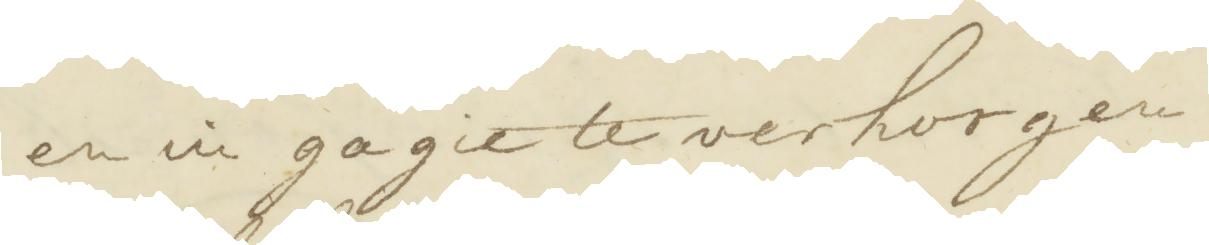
en in gagie te verhoogen
